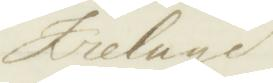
Krelage
